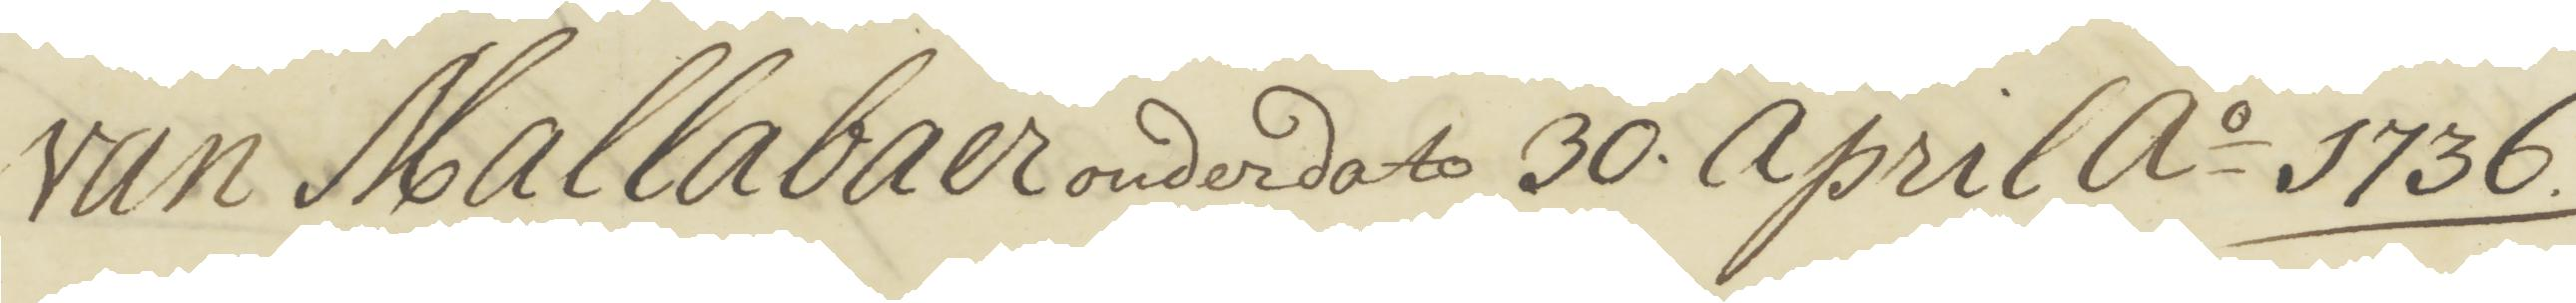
van Mallabaer onder dato 30. April A=o 1736.
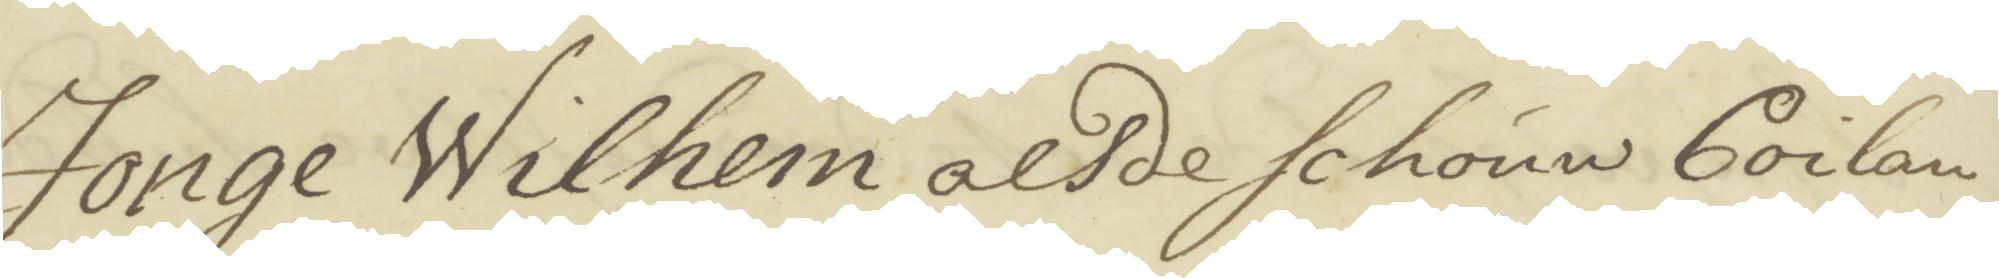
Jonge Wilhem als de schouw Coilan
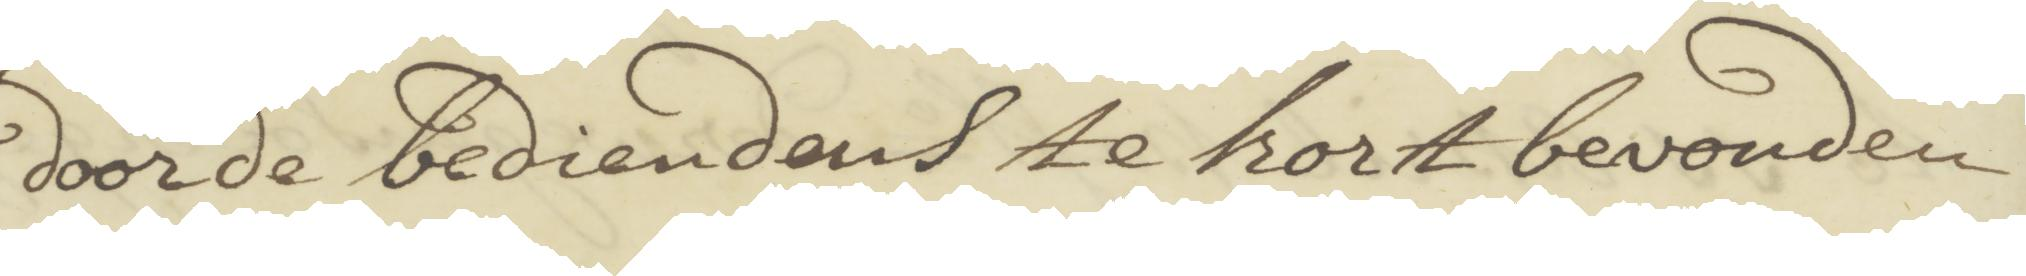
door de bediendens te kort bevonden
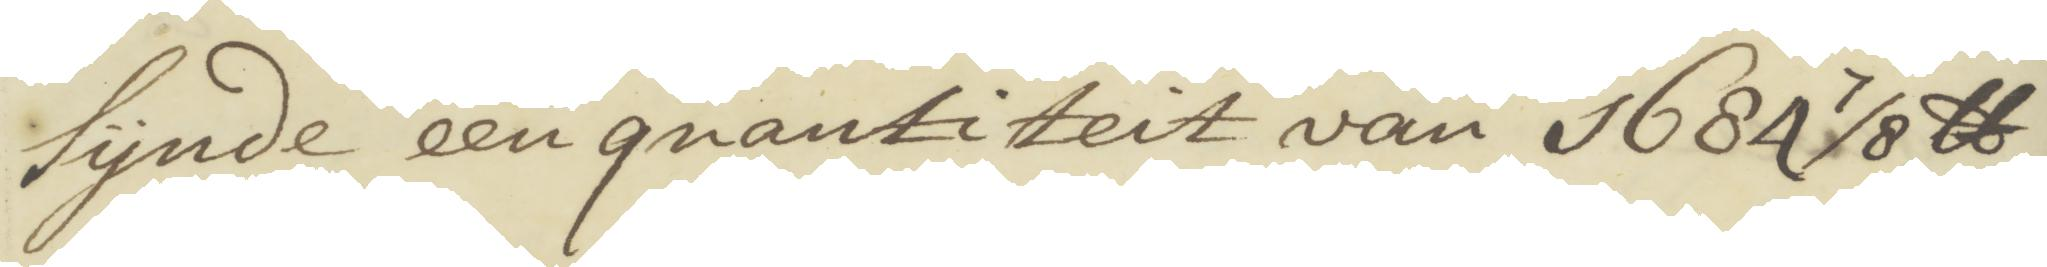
sijnde een quantiteit van 1684 7/8 lb
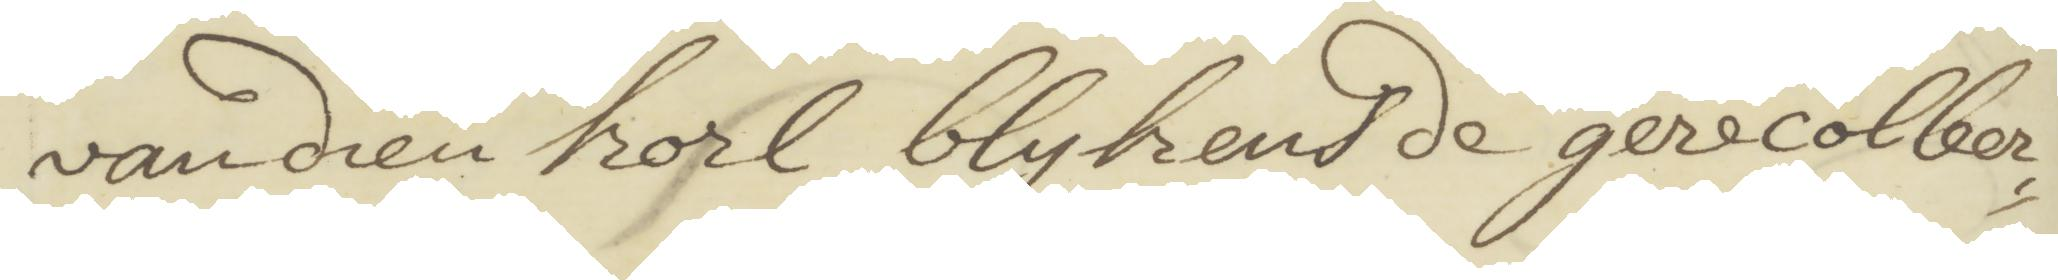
van dien korl blykens de gerecolleer„
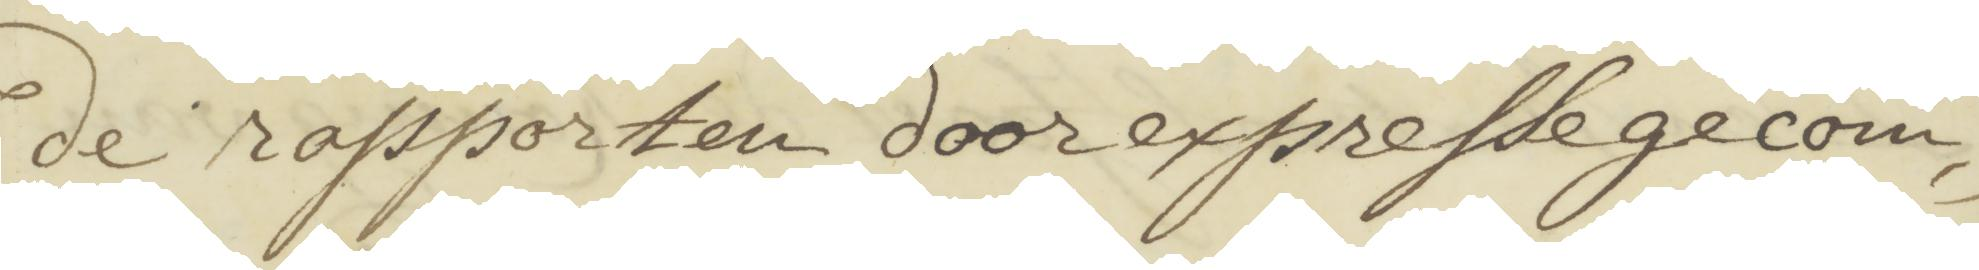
de rapporten door expresse gecom„
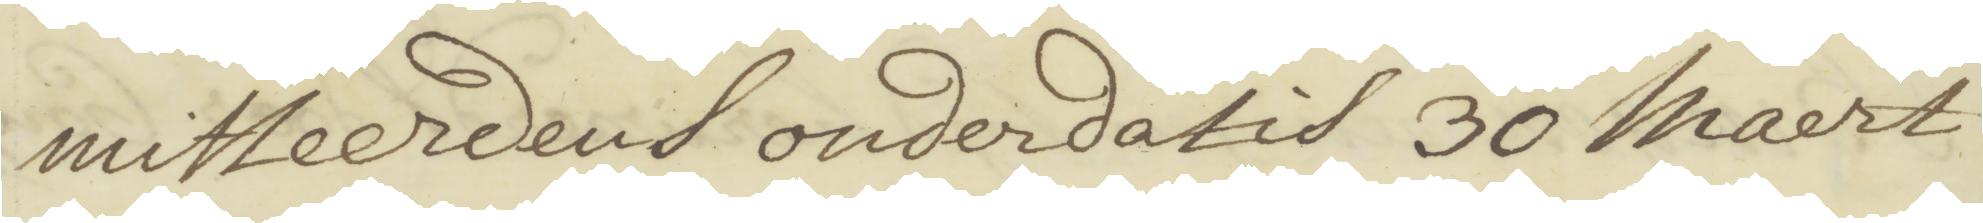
mitteerdens onderdatis 30 Maert
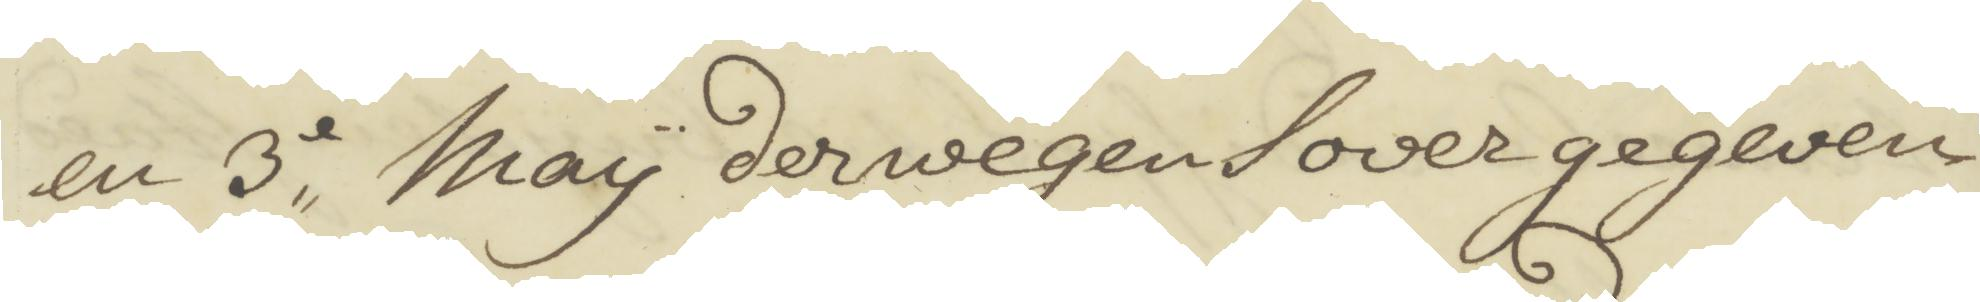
en 3„e Maij derwegens overgegeven
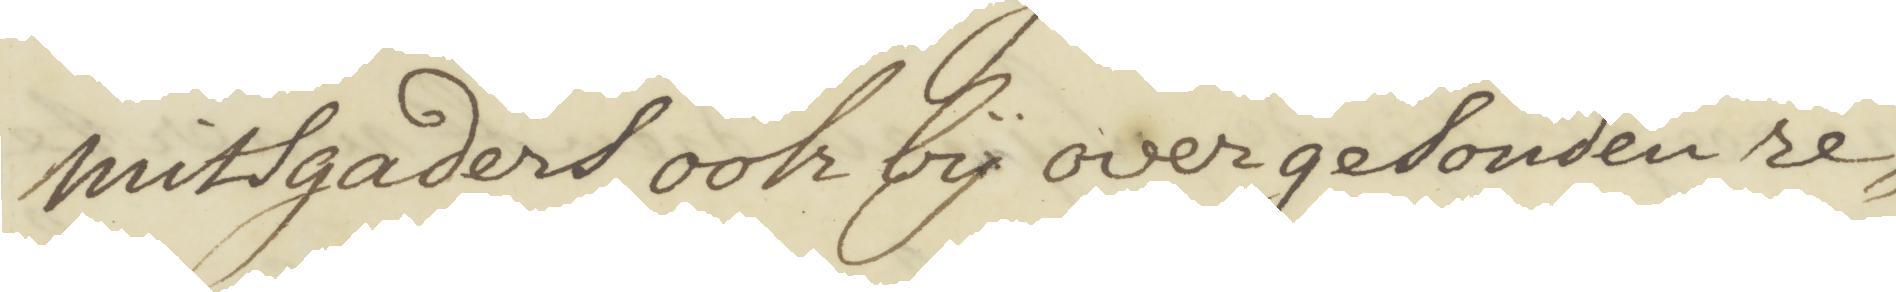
mitsgaders ook bij overgesonden re„
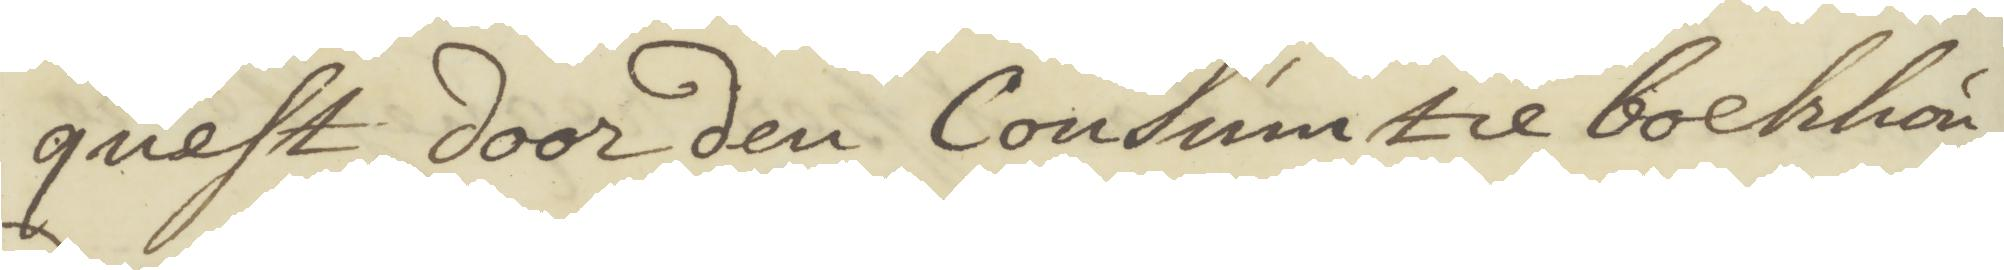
quest door den Consumtie boekhou
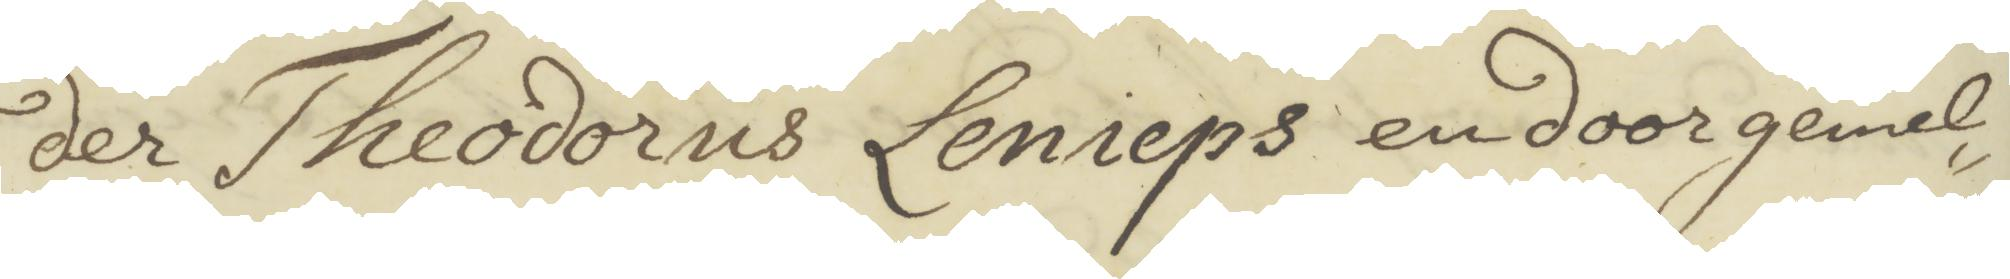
der Theodorus Lenieps en door gemel„
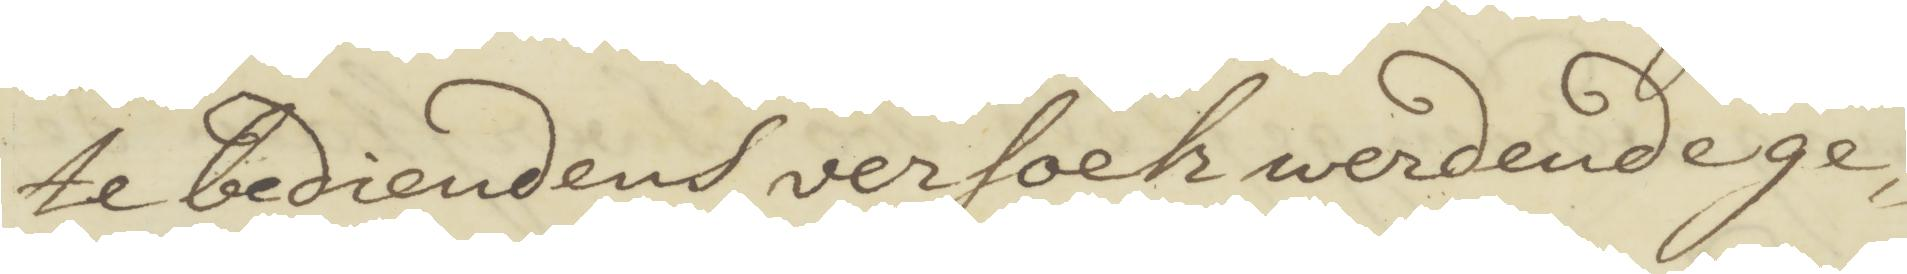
te bediendens versoek werdende ge„
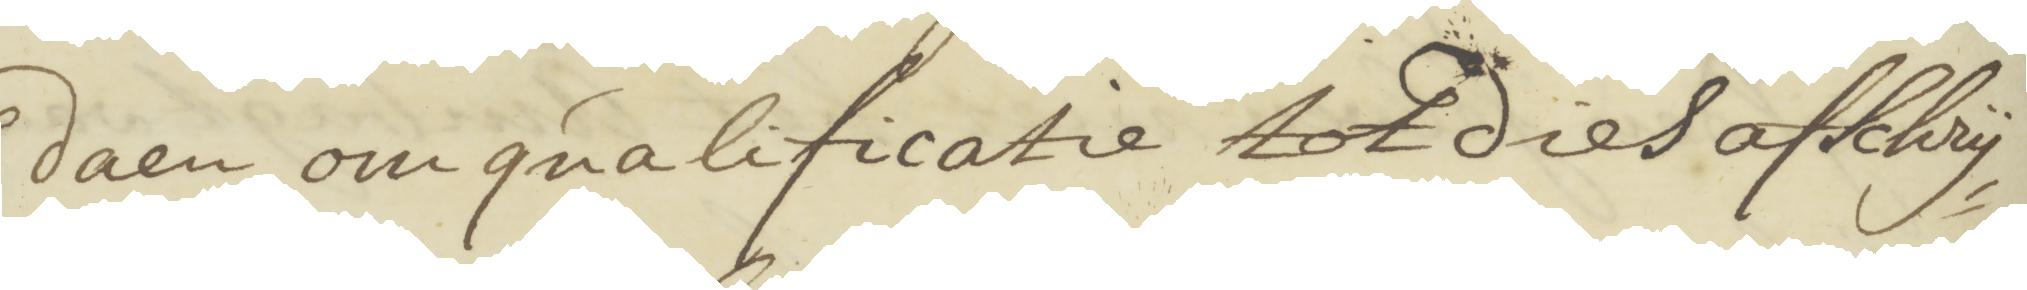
daen om qualificatie tot dies afschrij„
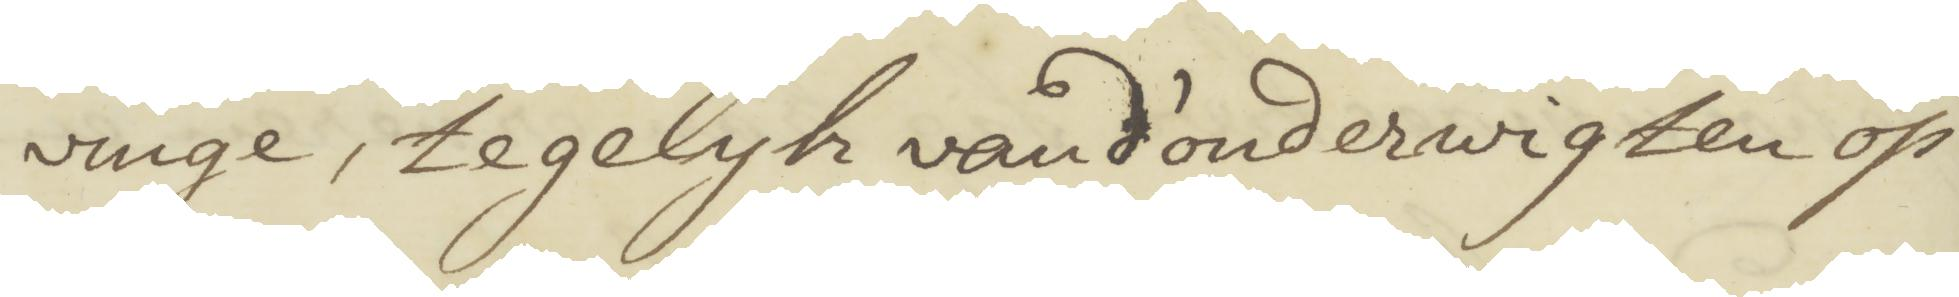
vinge, tegelyk van d’onderwigten op
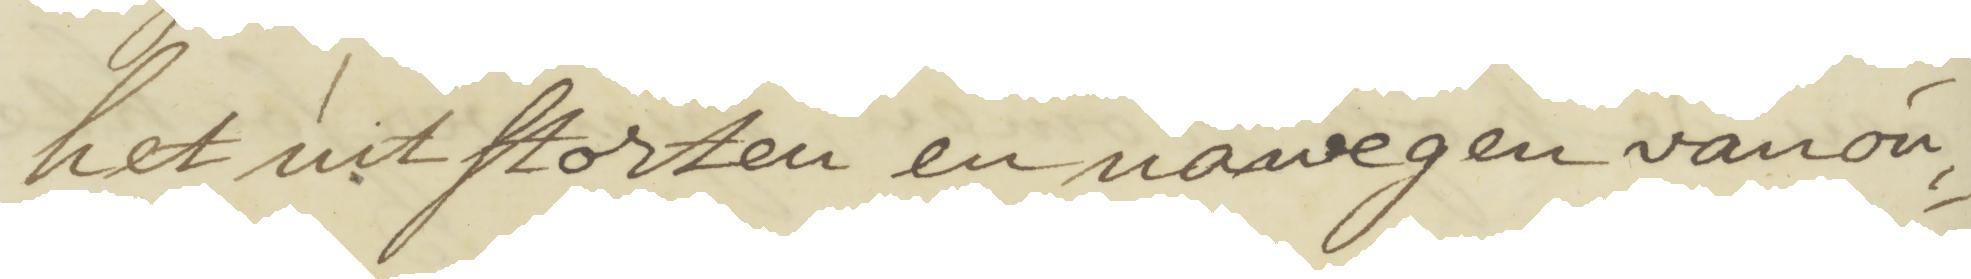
het uit storten en nawegen van ou„
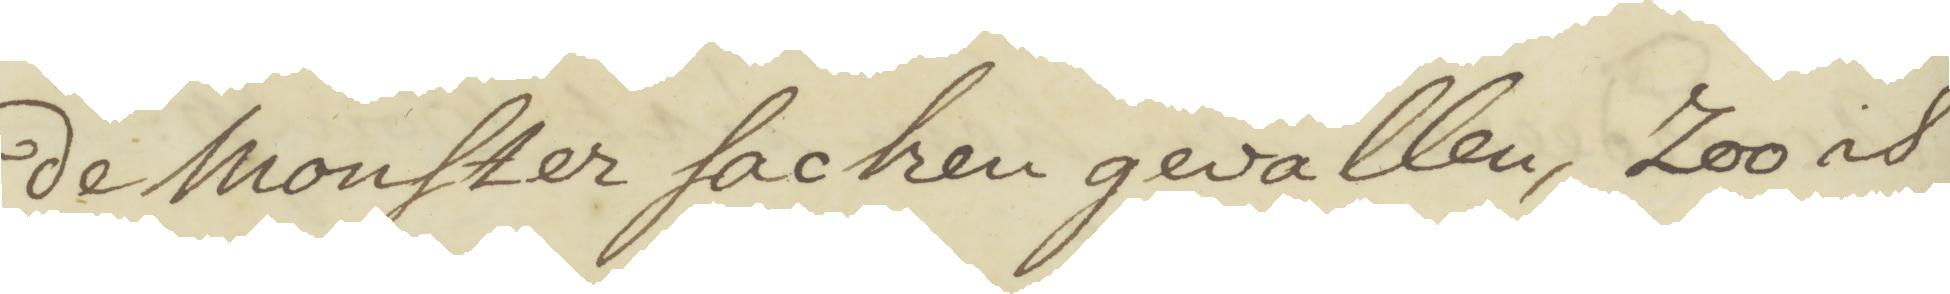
de monster sacken gevallen, zoo is
